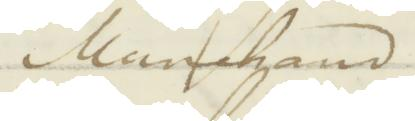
Marchand
